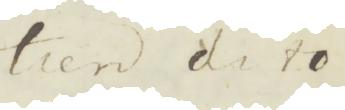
tien de 10
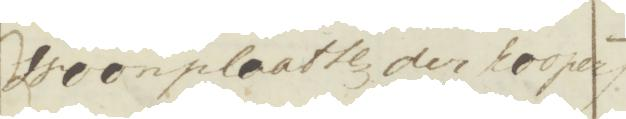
Woonplaatse der koopers
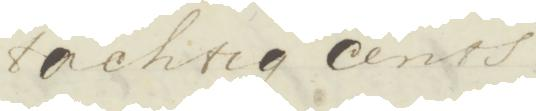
tachtig cents
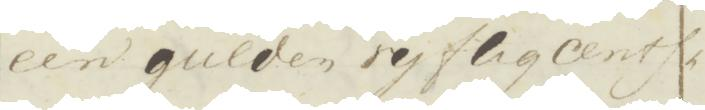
een gulden vyftig cents
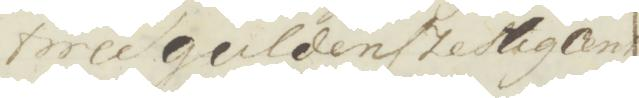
twee gulden zestig cents
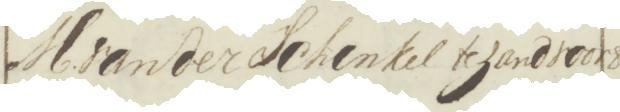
M van der Schenkel te zandvoort
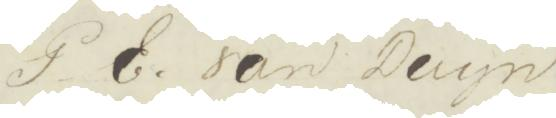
P:E. van Duyn
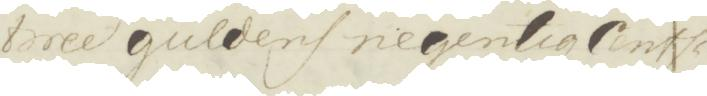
twee guldens negentig cents
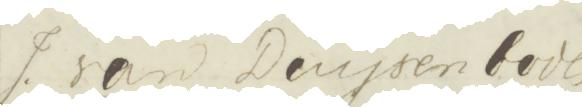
J: van Duyvenboden
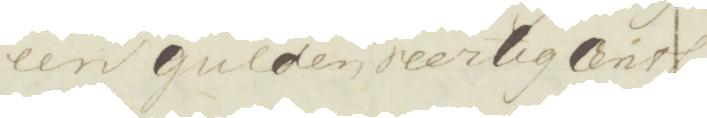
een gulden veertig Cents„
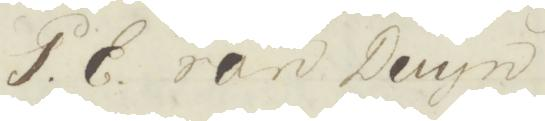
P.E. van Duijn
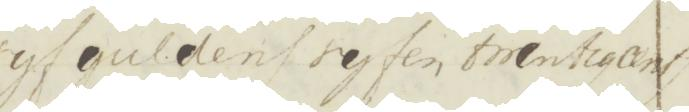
vyf gulden vyfen twintig cents
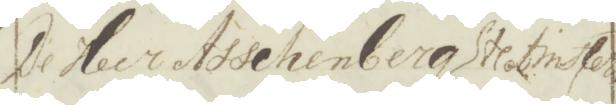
De Heer Asschenbergh te Amsterdam
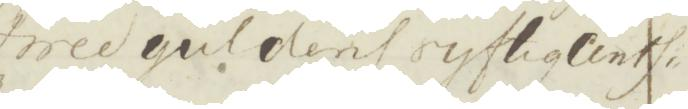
twee guldens vyftig Cents
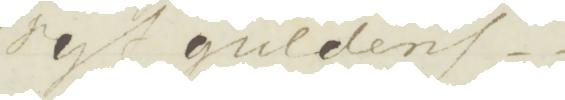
vyf guldens -
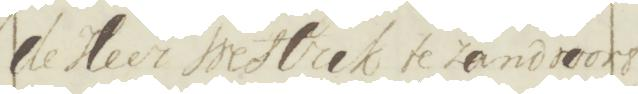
de Heer Westrik te zandvoort
